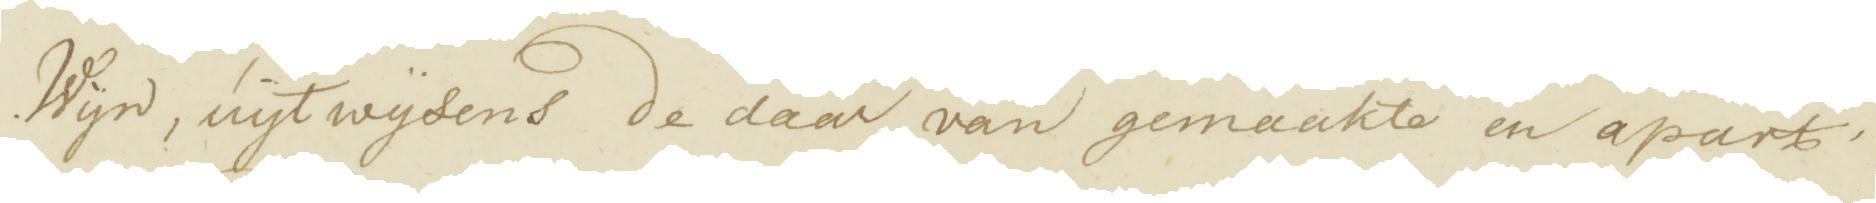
Wijn, uijt wijsens de daar van gemaakte en apart
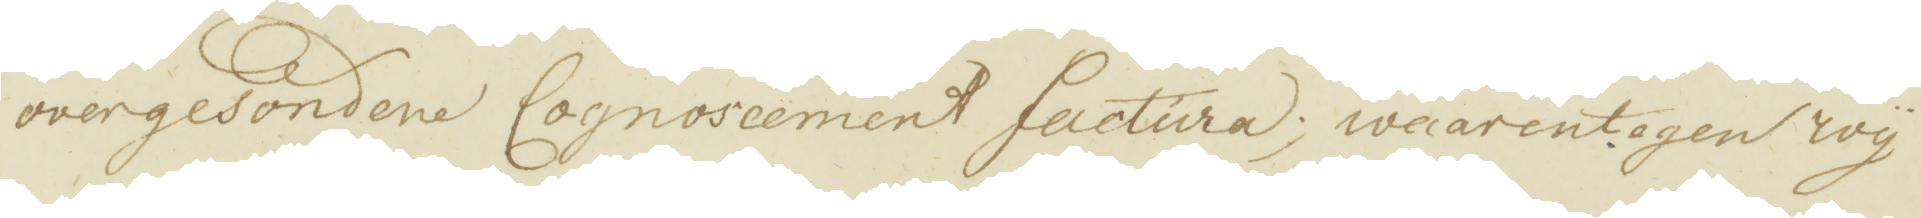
overgesondene Cognoscement factura; waarentegen wij
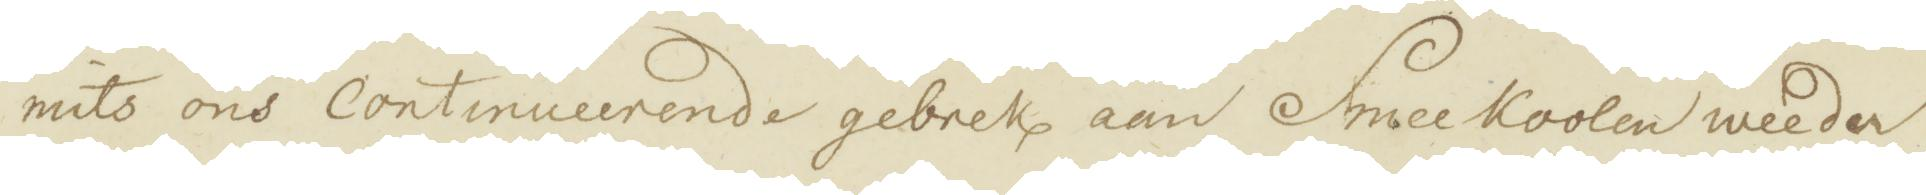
mits ons continueerende gebrek aan Smeekoolen weeder
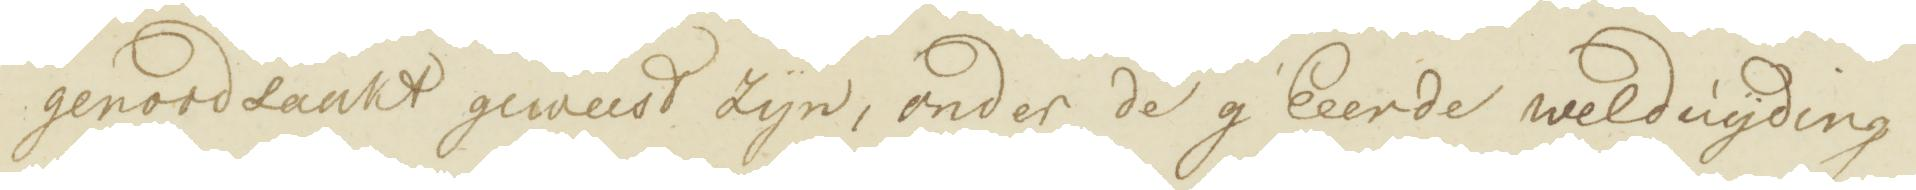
genoodsaakt geweest zijn, onder de g’Eeerde welduijding
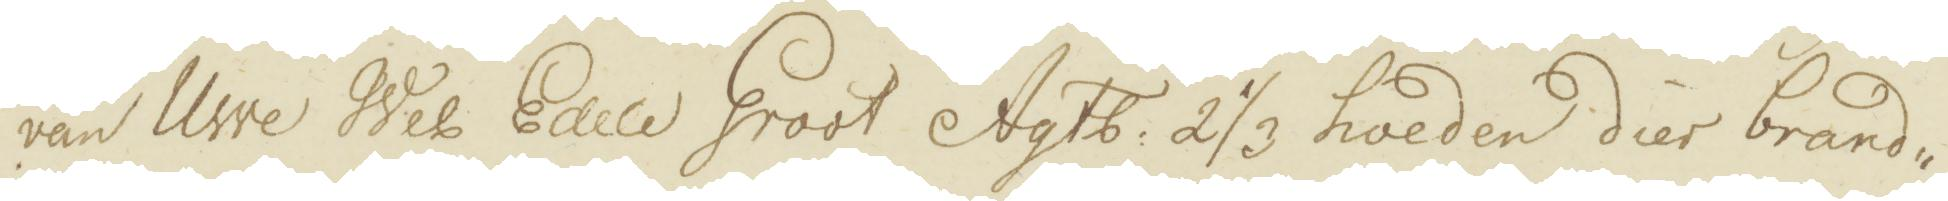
van Uwe Wel Edele Groot Agtb: 2 1/3 hoeden dier brand„
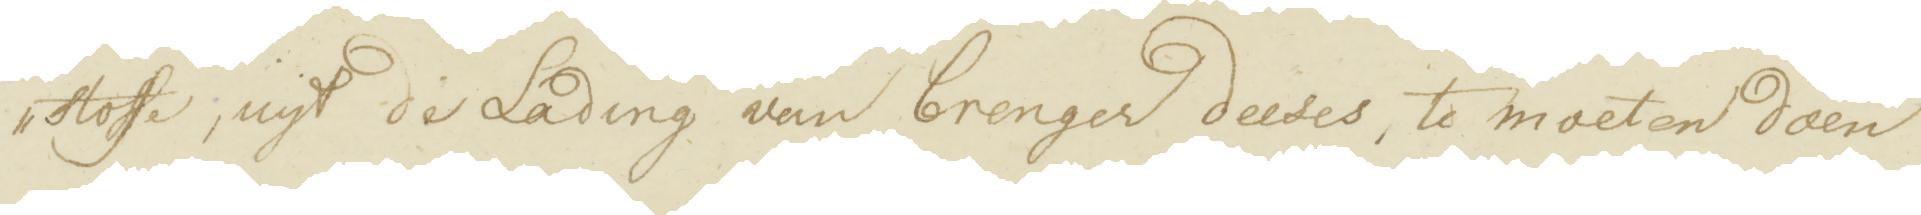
„stoffe, uijt de Lading van brenger deeses, te moeten doen
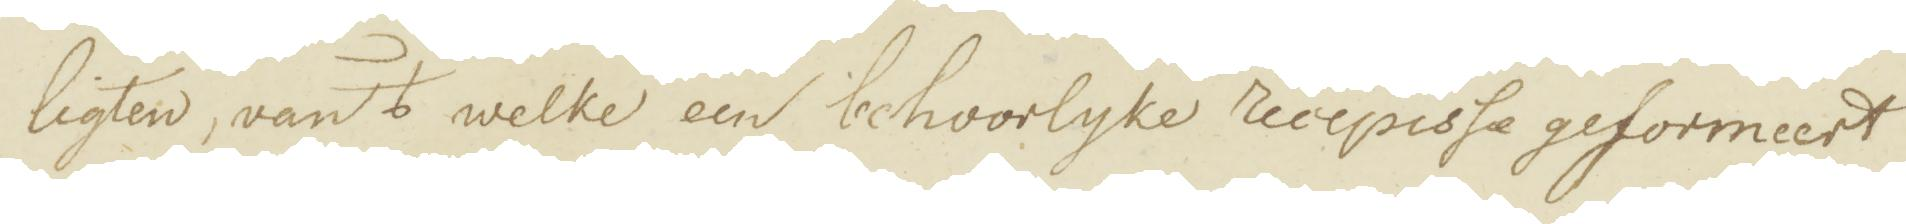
ligten, van ’t welke een behoorlijke recepisse geformeert
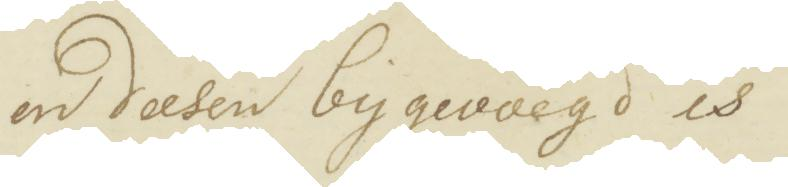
en deesen bij gevoegd is
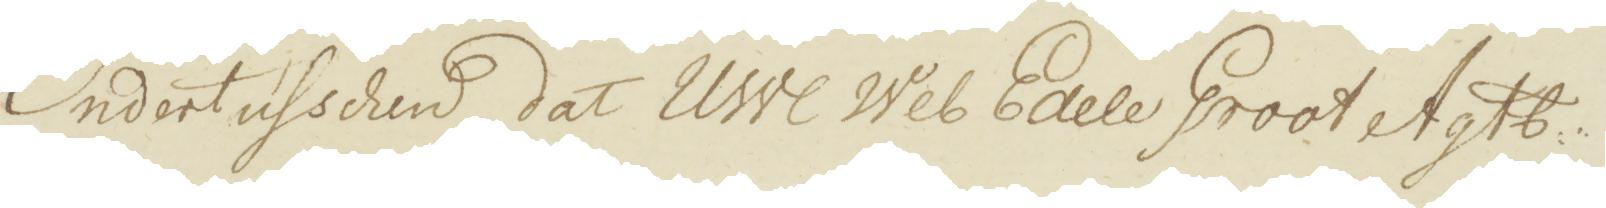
Ondertusschen dat Uwe Wel Edele Groot Agtb::
